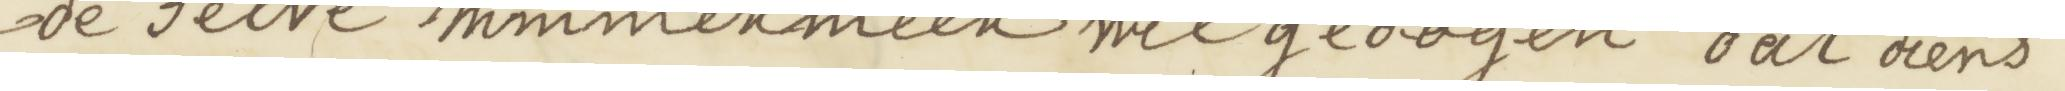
de selve nimmermeer wel gedogen dat diens
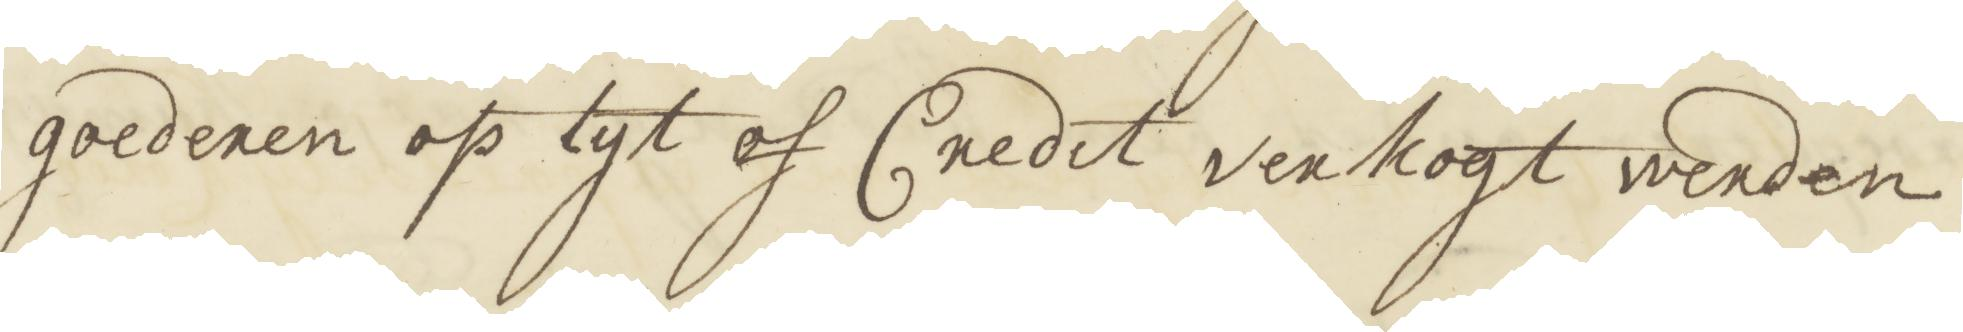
goederen op tyt of Credit verkogt werden
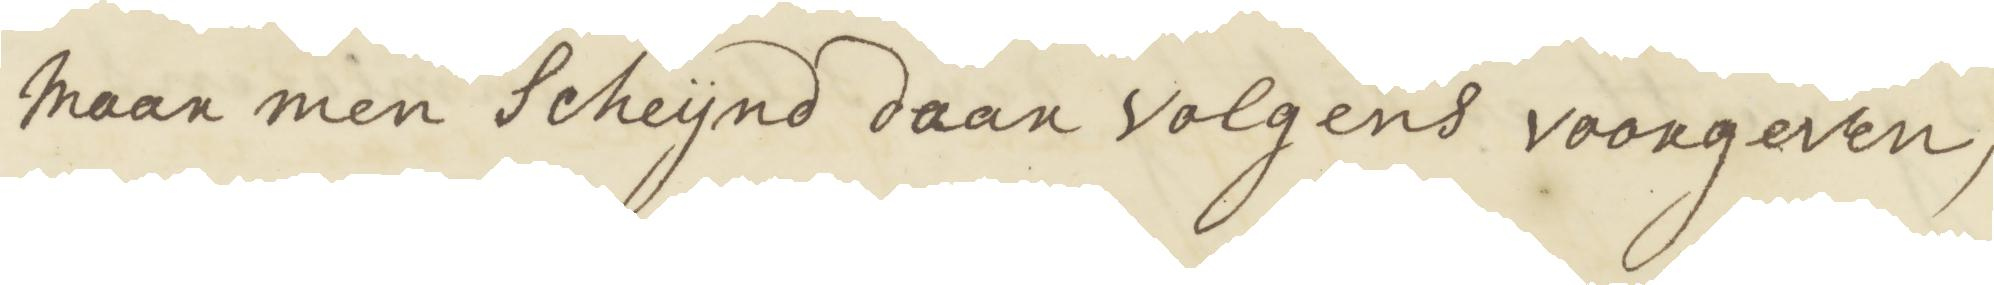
maar men scheijnd daar volgens voorgeven,
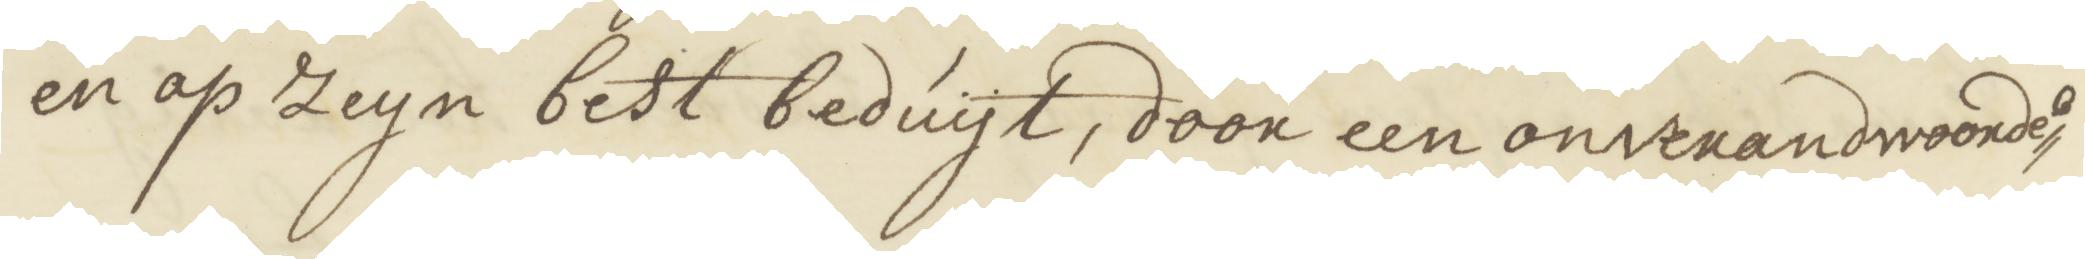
en op zeyn best beduijt, door een onverandwoorde„e
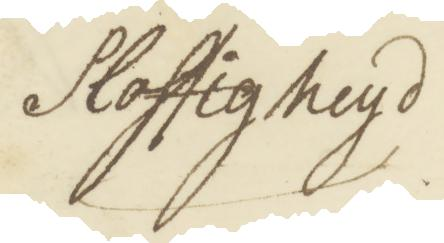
sloffigheyd
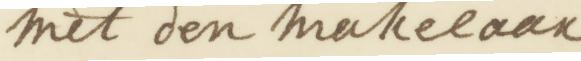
met den makelaar
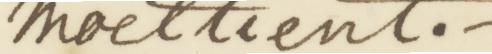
moeltient.
